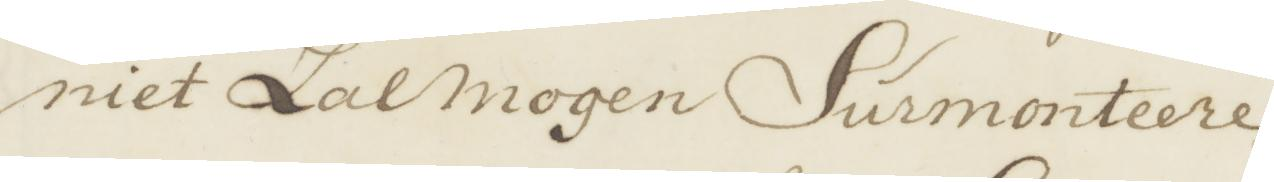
niet zal mogen Surmonteere
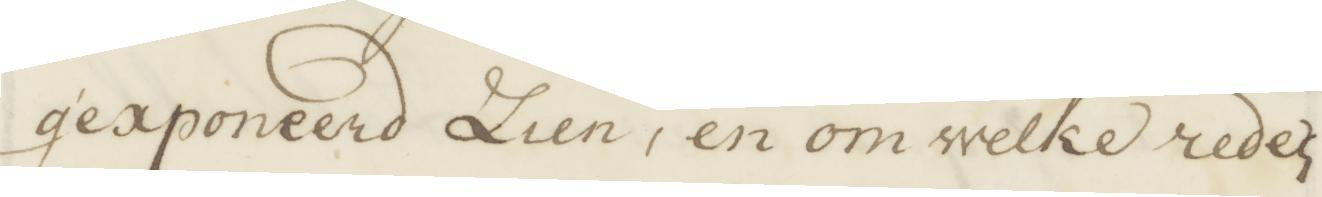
g'exponeerd zien, en om welke reden
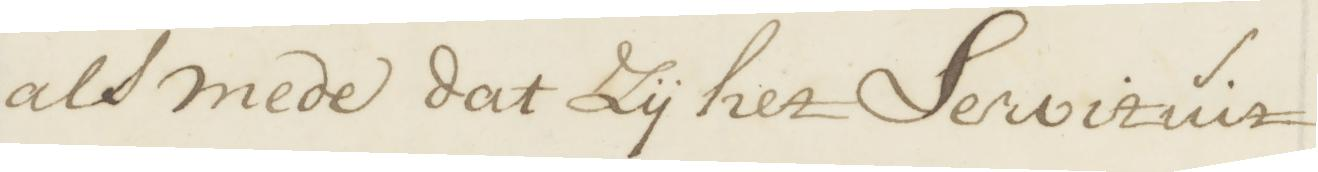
als mede dat zij het Servituit
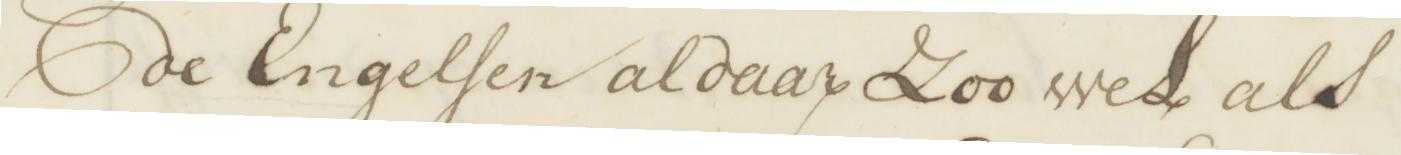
de Engelsen aldaar zoo wel als
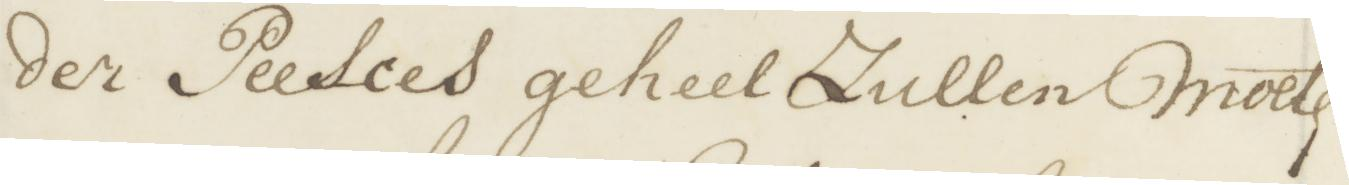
der Peesces geheel zullen moeten
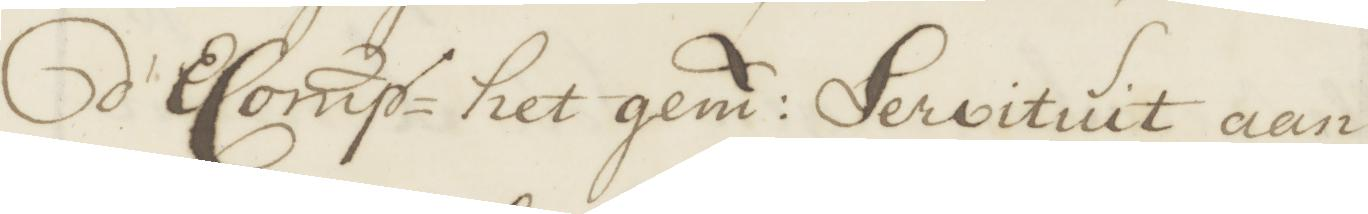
d’EComp=s het gem: Servituit aan
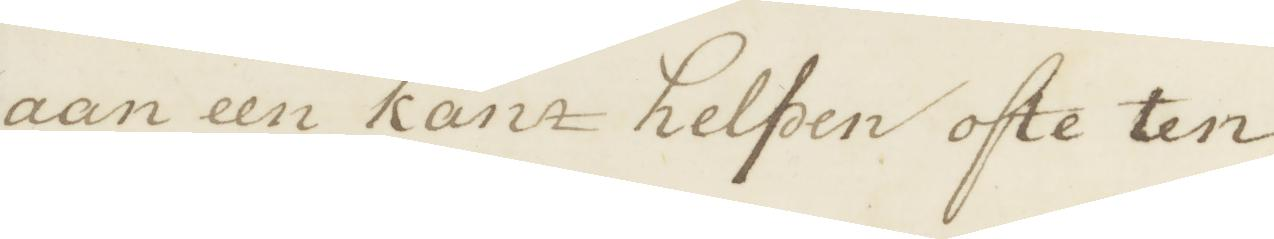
aan een kant helpen ofte ten
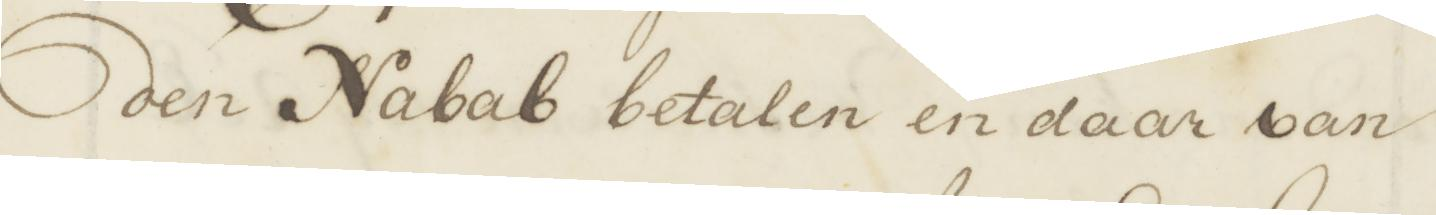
den Nabab betalen en daar van
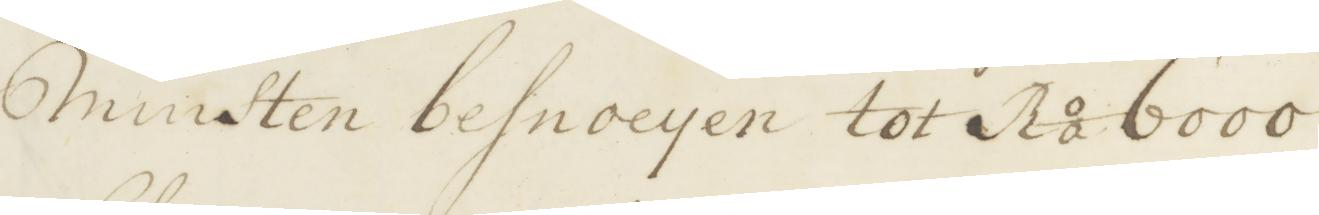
minsten besnoeyen tot Ro/a 6000
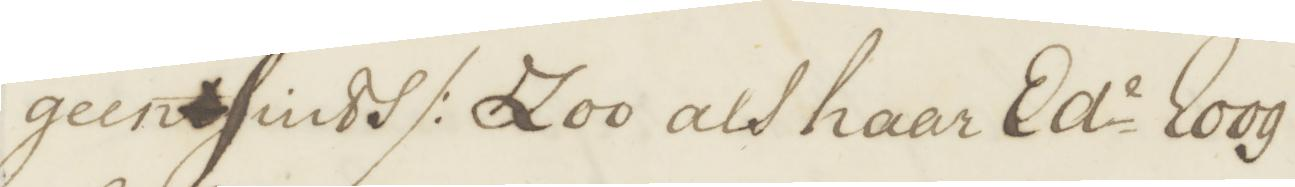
geentsints /: zoo als haar Ed=e hoog
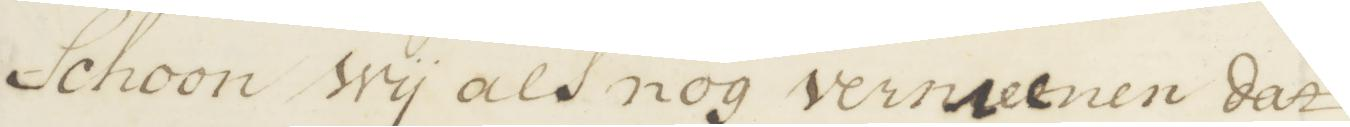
schoon wij als nog vermeenen dat
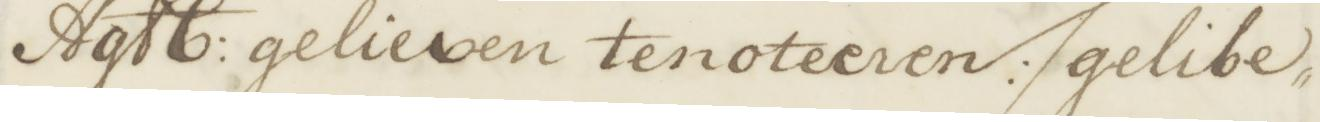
Agtb: gelieven te noteeren:/ gelibe„
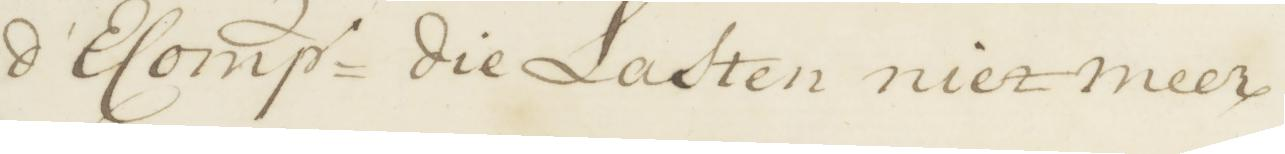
d’EComp=s die lasten niet meer
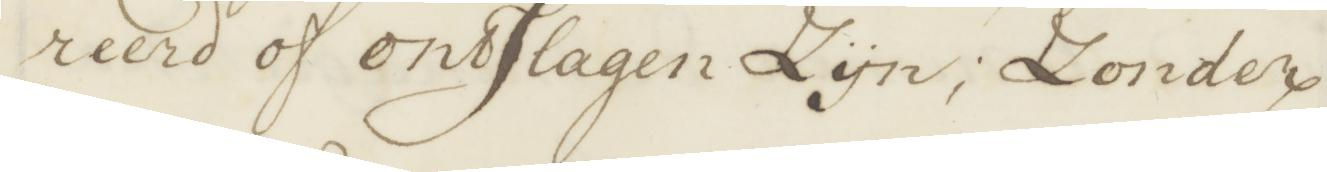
reerd of ontslagen zijn; zonder
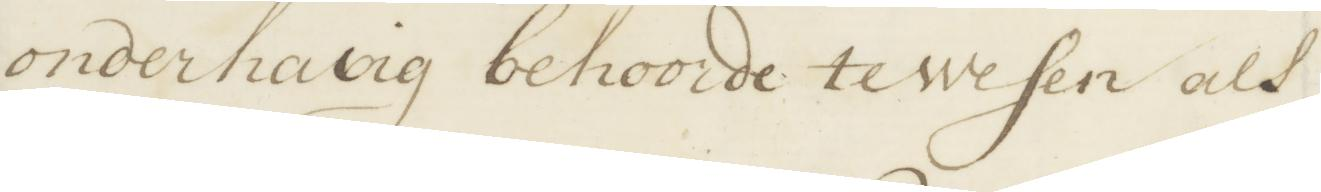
onderhavig behoorde te wesen als
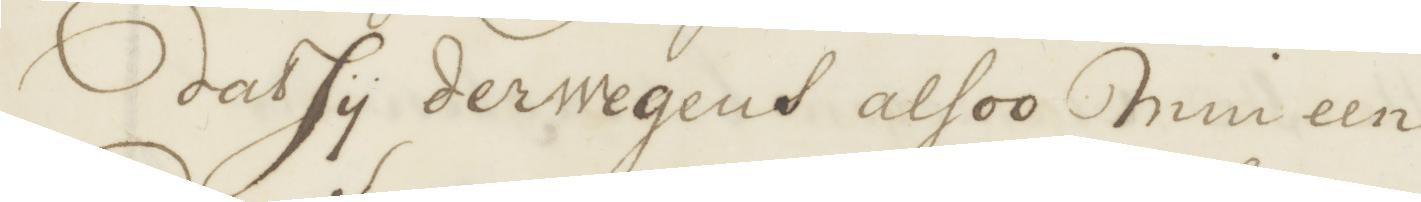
dat sij derwegens alsoo min een
